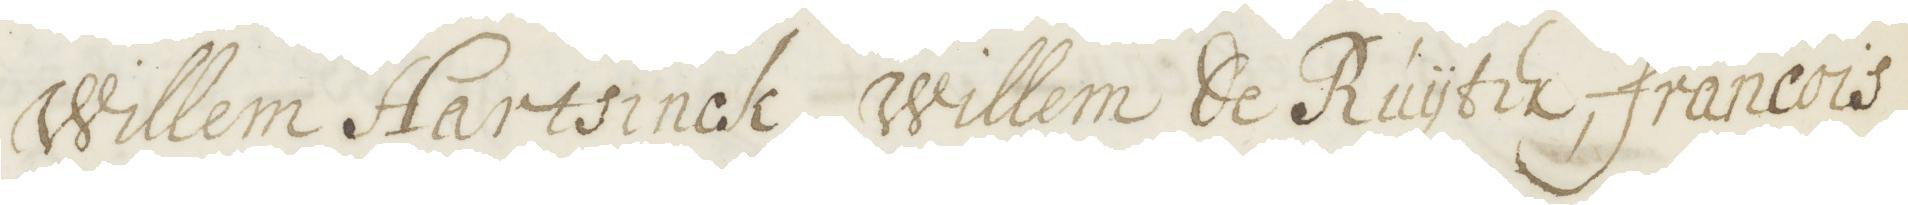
Willem Hartsinck, Willem de Ruijter, Francois
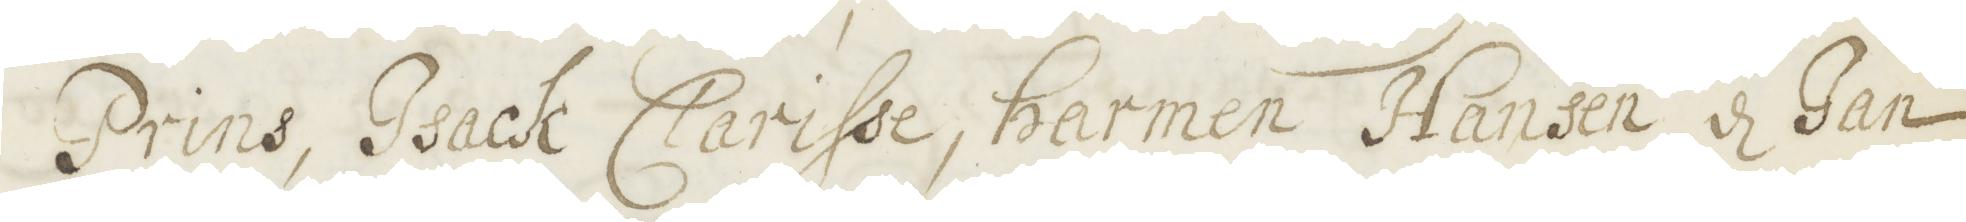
Prins, Isack Charisse, harmen Hansen, en Ian
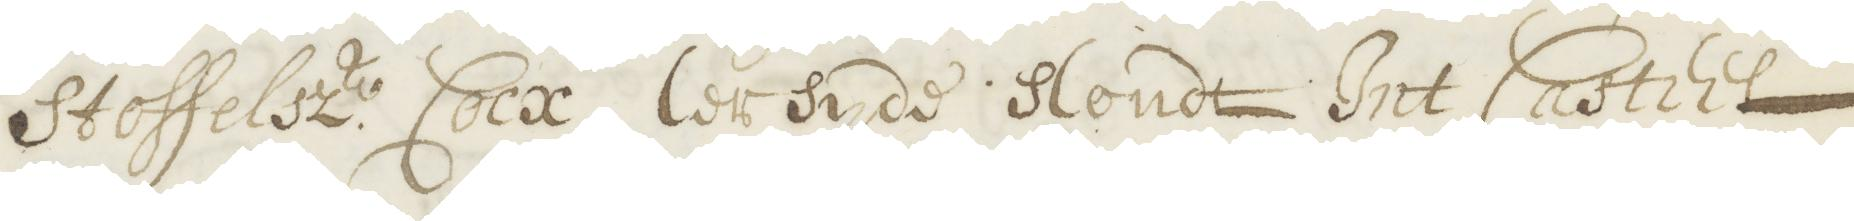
stoffelsz.n Cocx, ter syde stondt Int Casteel
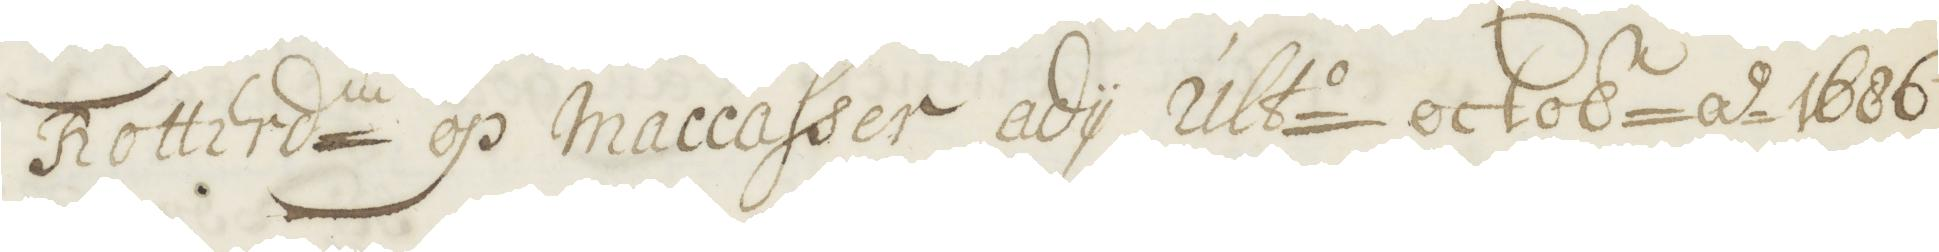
Rotterd=m op maccasser adij ult=o octob=r a=o 1686
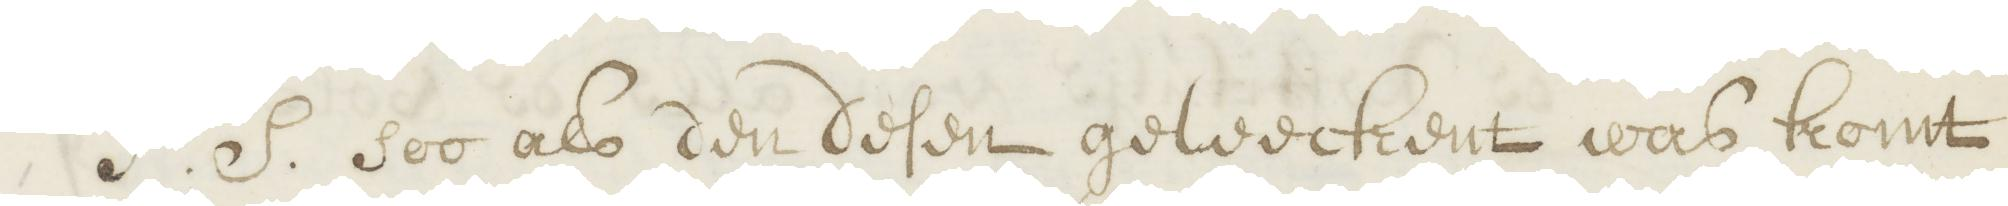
P. S. soo als den desen geteeckent was, komt
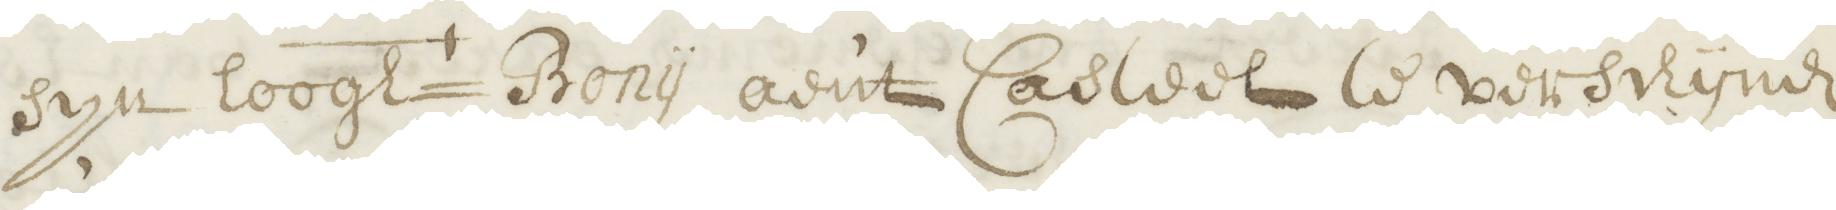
syn hoogh=t Bonij aen't Casteel te verschijnen
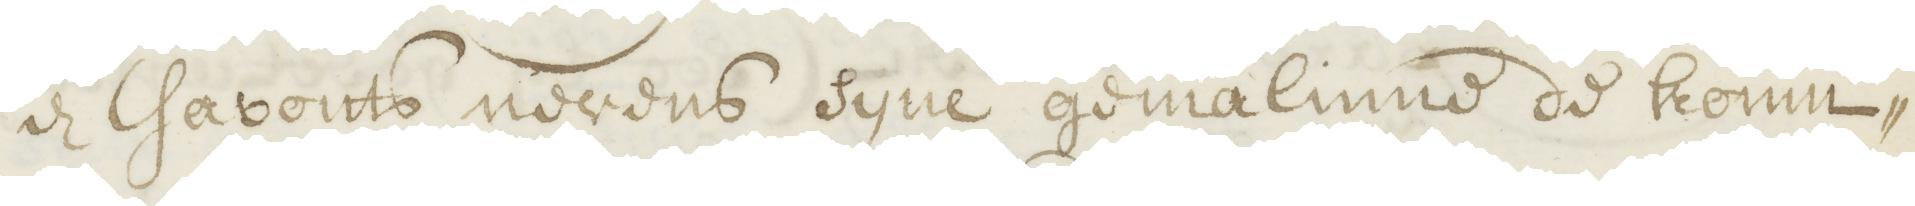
en 'tsavonts nevens sijne gemalinne de konin„
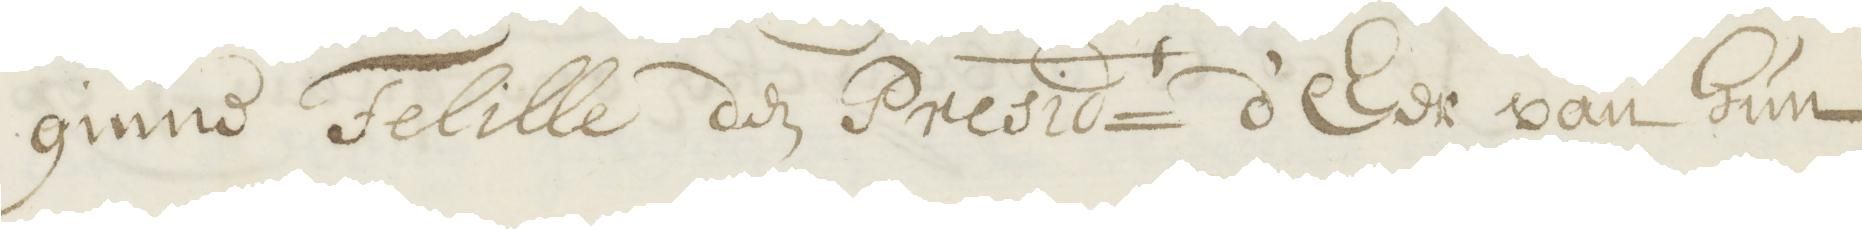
ginne Felille den Presid=t d’ Eer van hun
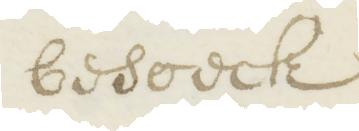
besoeck
